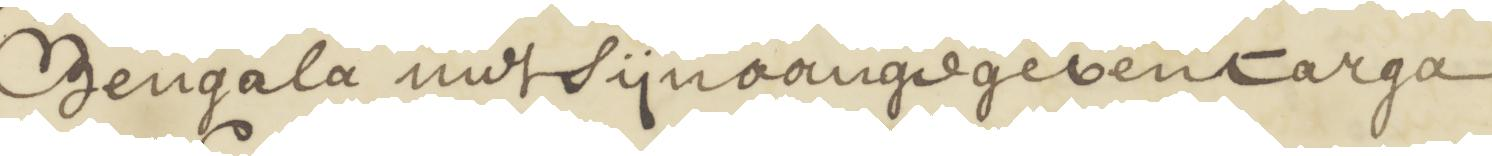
Bengala met sijn aangegeven carga
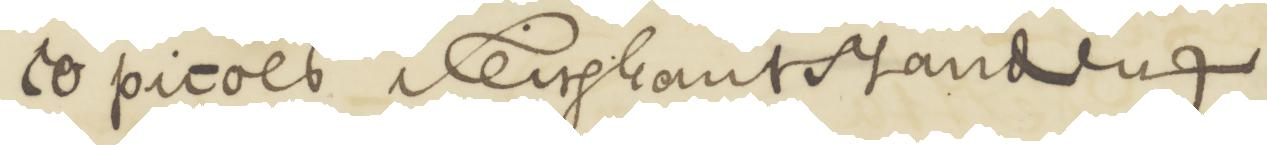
50 picols Eliphantstanden
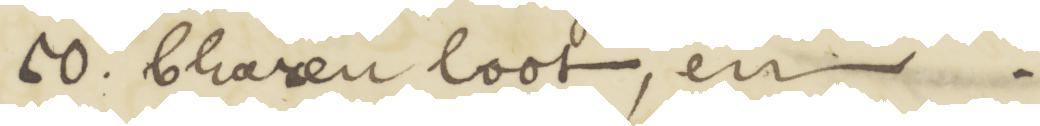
50. bharen loot, en
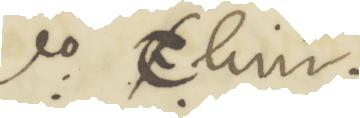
30 _:o Thin
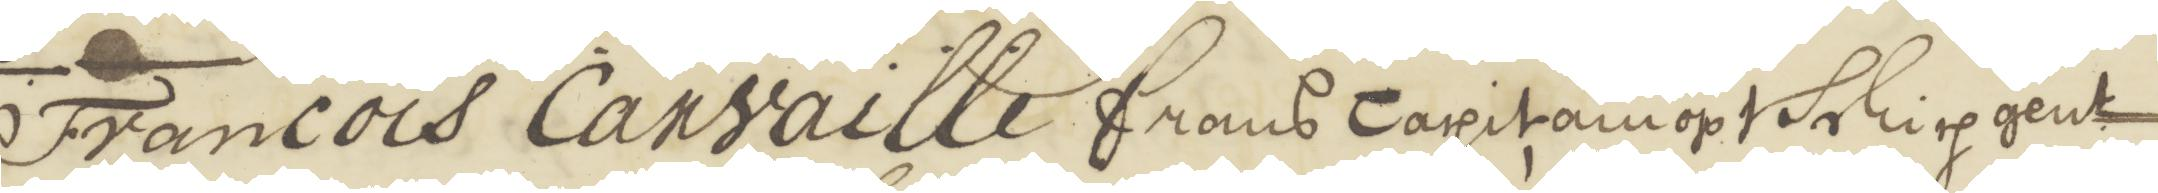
31: maij Francois Carvaille frans capitain op 't schip gen=t
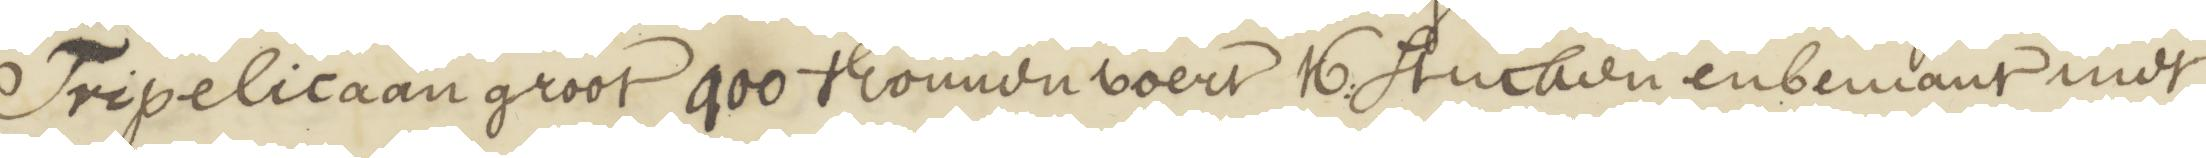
Tripelicaan groot 400 thonnen voert 16: stucken en bemant met
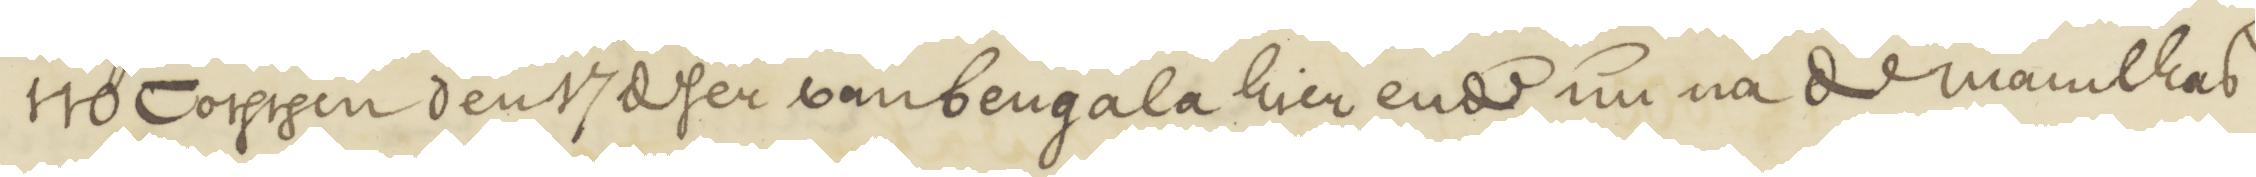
110 coppen den 17 deser van bengala hier ende nu na de manilhas
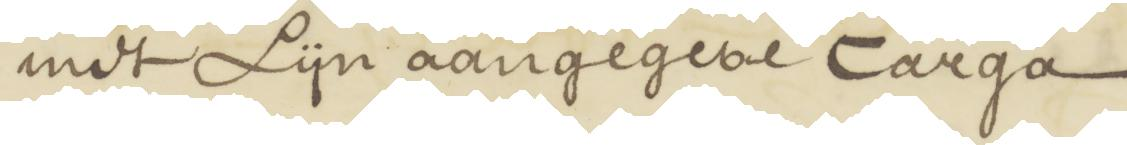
met zijn aangegeve carga
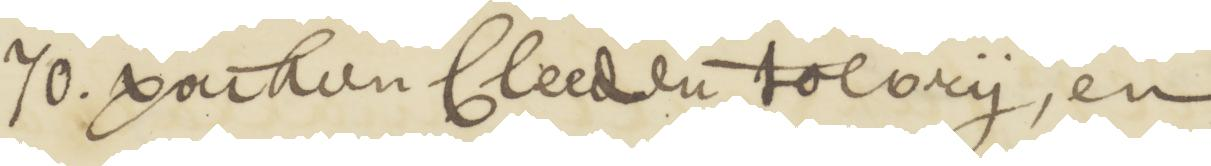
70. packen cleeden tolvrij, en
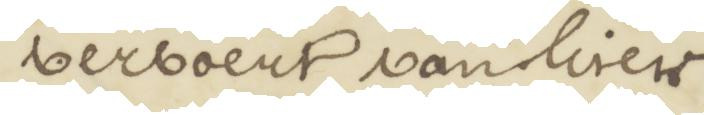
vervoert van hier
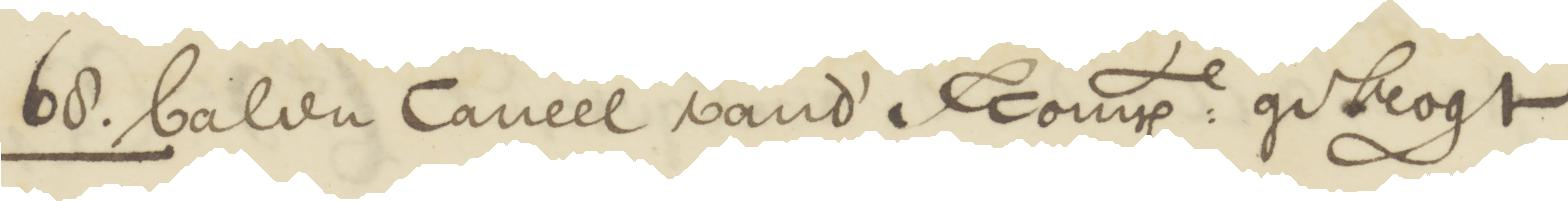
68. balen caneel van d’ Ecomp:e gekogt
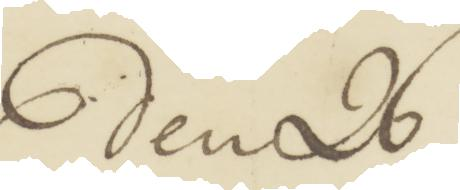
den 26
